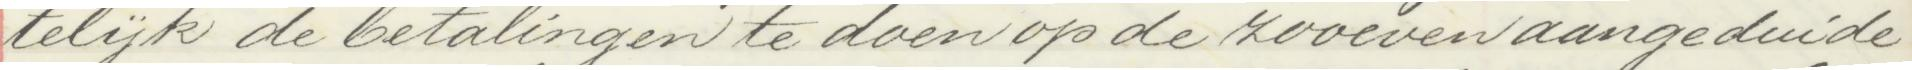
telijk de betalingen te doen op de zooeven aangeduide
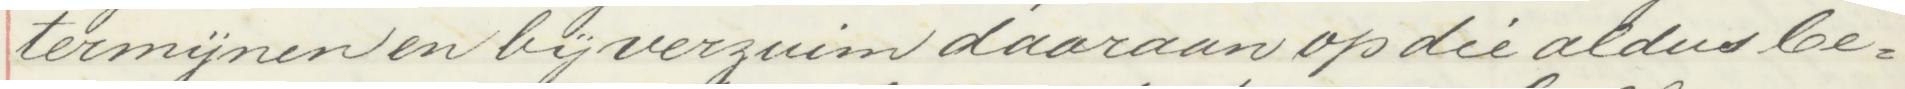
termijnen en bij verzuim daaraan op die aldus be=
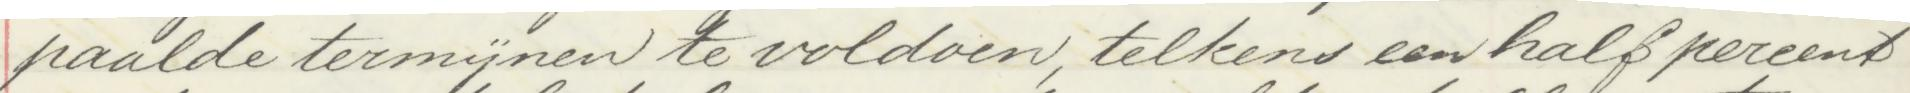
paalde termijnen te voldoen telkens een half percent
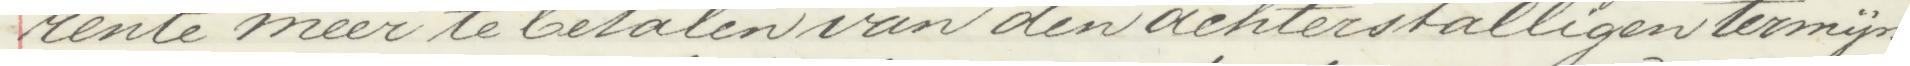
rente meer te betalen van den achterstalligen termijn
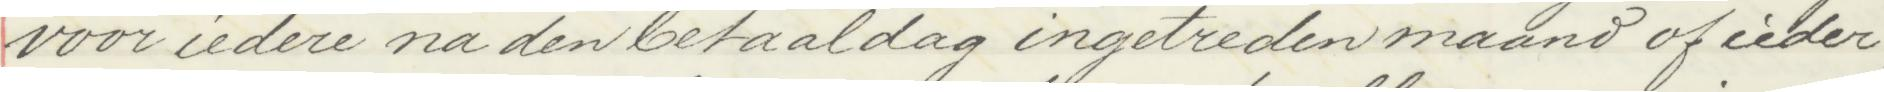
voor iedere na den betaaldag ingetreden maand of ieder
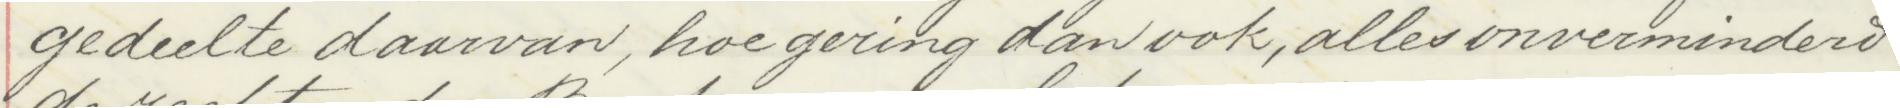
gedeelte daarvan, hoe gering dan ook, alles onverminderd
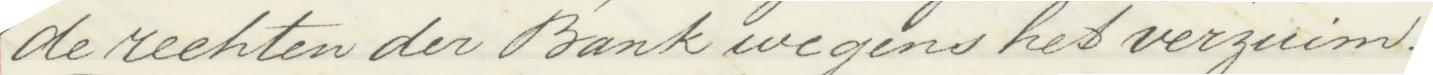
de rechten der Bank wegens het verzuim.
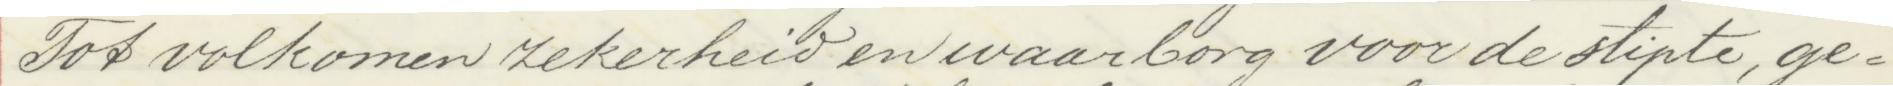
Tot volkomen zekerheid en waarborg voor de stipte, ge=
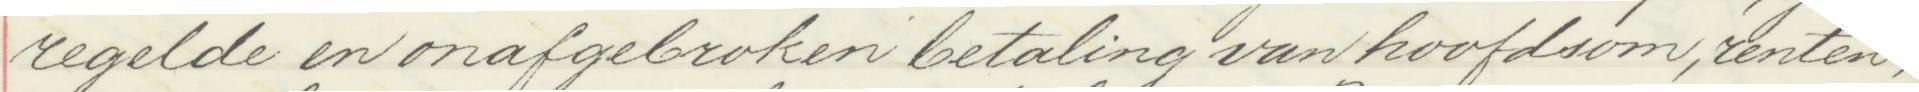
regelde en onafgebroken betaling van hoofdsom, renten,
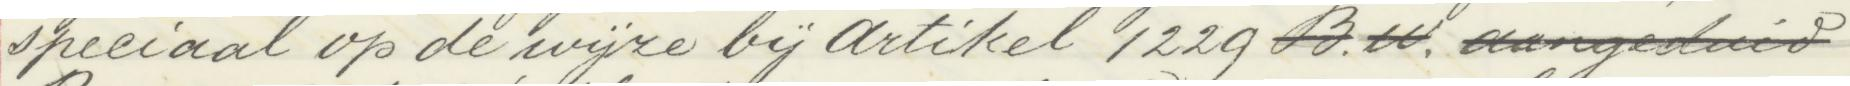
speciaal op de wijze bij Artikel 1229 B. w. aangeduid
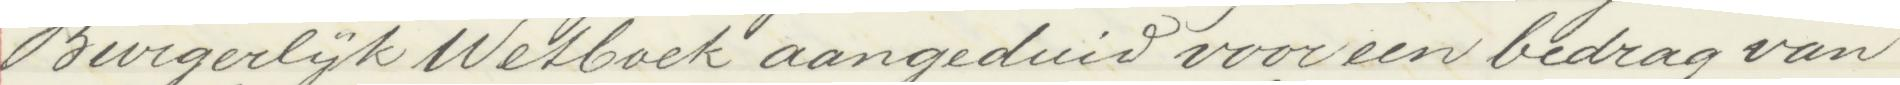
Burgerlijk Wetboek aangeduid voor een bedrag van
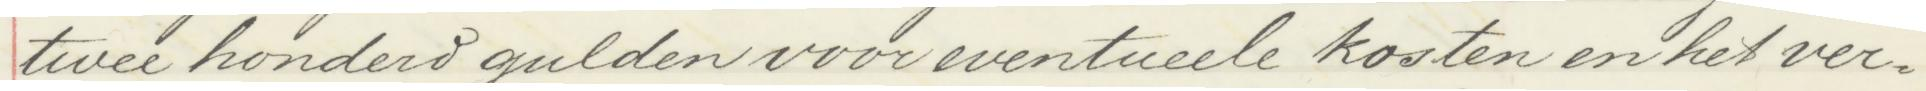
twee honderd gulden voor eventueele kosten en het ver„
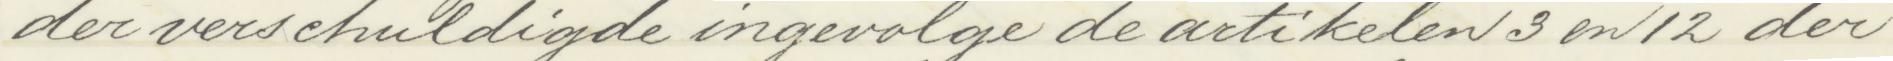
der verschuldigde ingevolge de artikelen 3 en 12 der
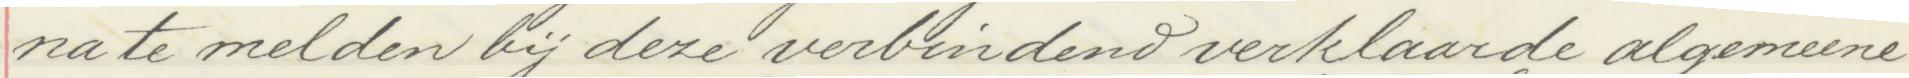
na te melden bij deze verbindend verklaarde algemeene
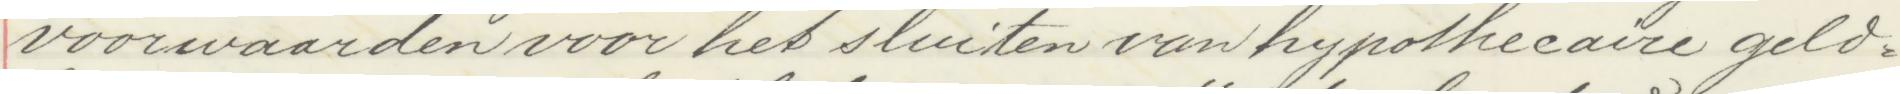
voorwaarden voor het sluiten van hypothecaire geld=
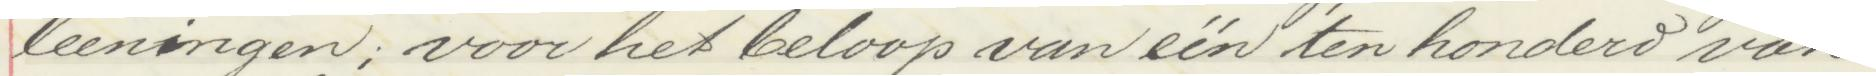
leeningen; voor het beloop van één ten honderd van
